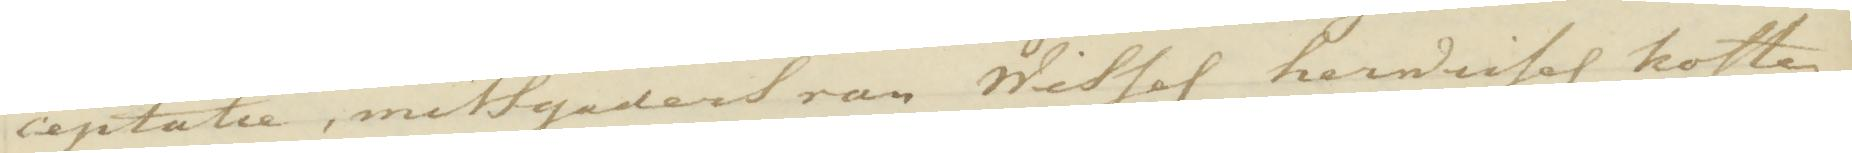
ceptatie, mitsgaders van Wissel herwissel kosten
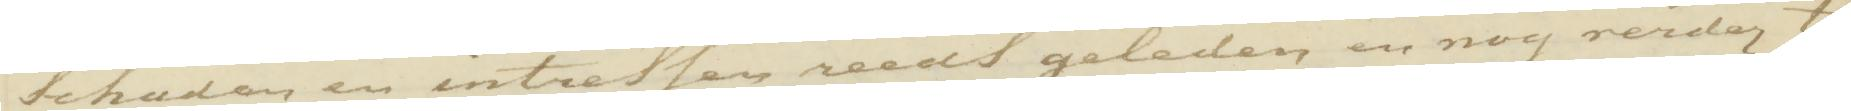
schaden en intressen reeds geleden en nog verder te
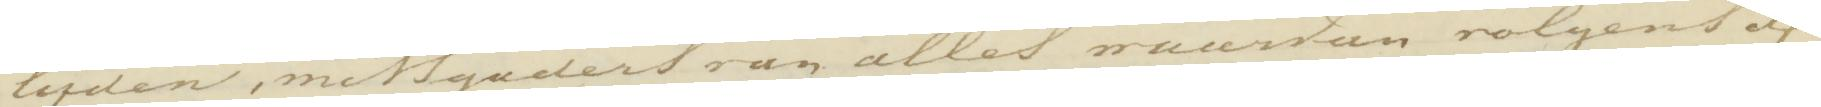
lyden, mitsgaders van alles waarvan volgens de
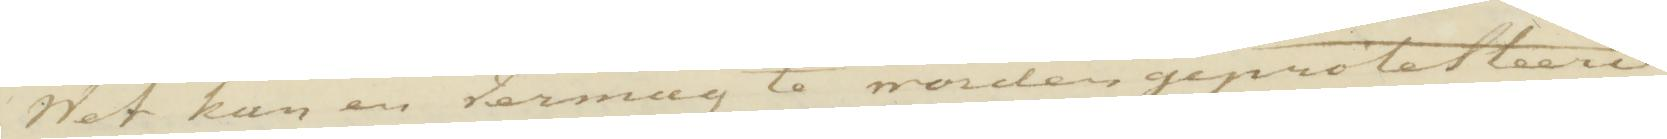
wet kan en vermag te worden geprotesteerd
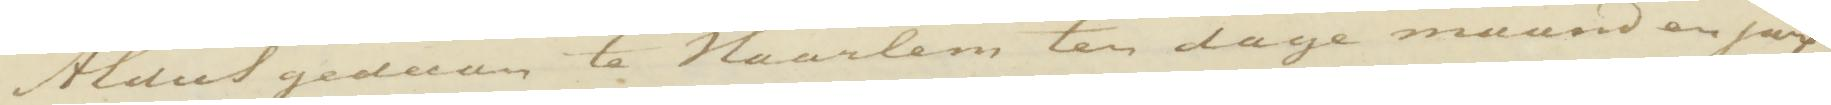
Aldus gedaan te Haarlem ten dage maand en jare
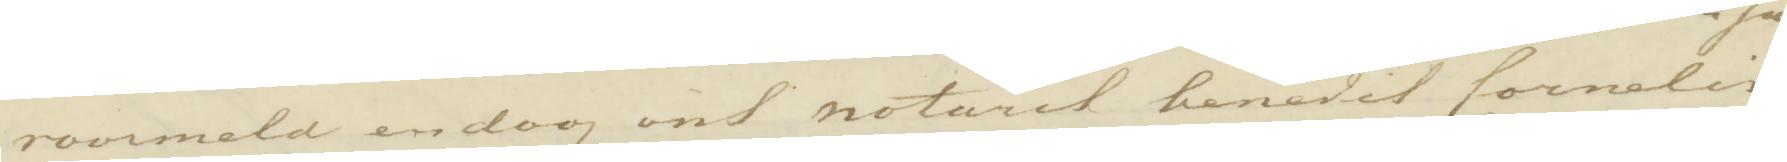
voormeld en door ons notaris beneves Cornelis
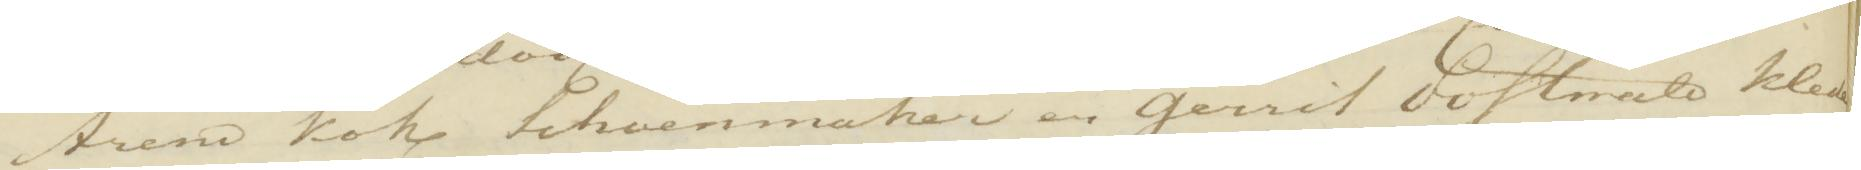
Arend kok Schoenmaker en Gerrit Oostwald klede
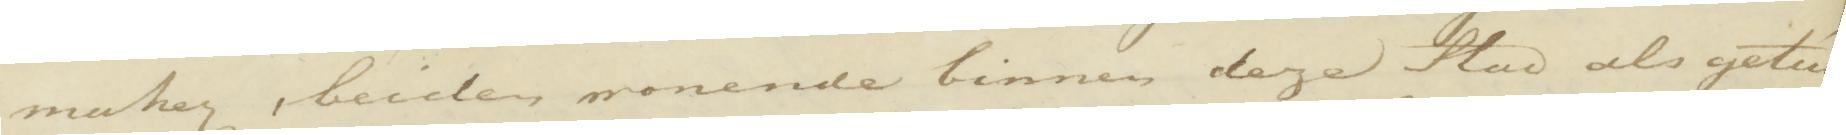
maker, beiden wonende binnen deze Stad als getui
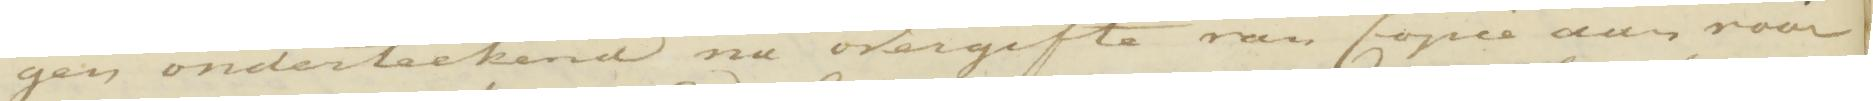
gen onderteekend na overgifte van Copie aan voor
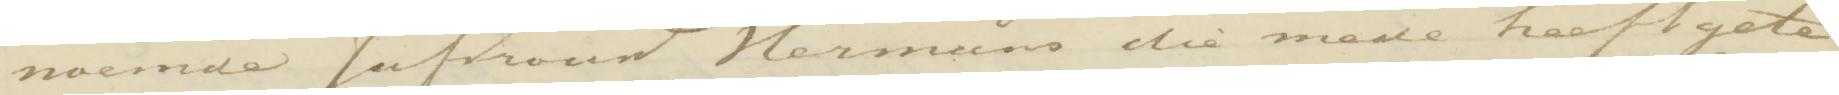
noemde Jufvrouw Hermans die mede heeft gete
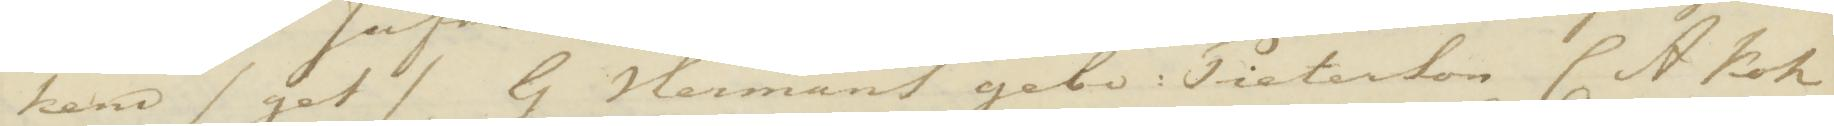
kend / get / G Hermans gebo: Pieterson C A Kok
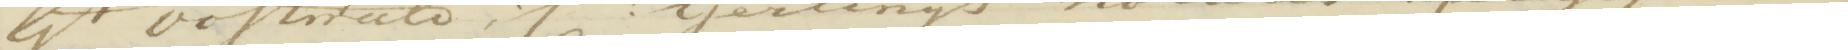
Gt oostwald, C: Gerlings notaris. Geregistreerd
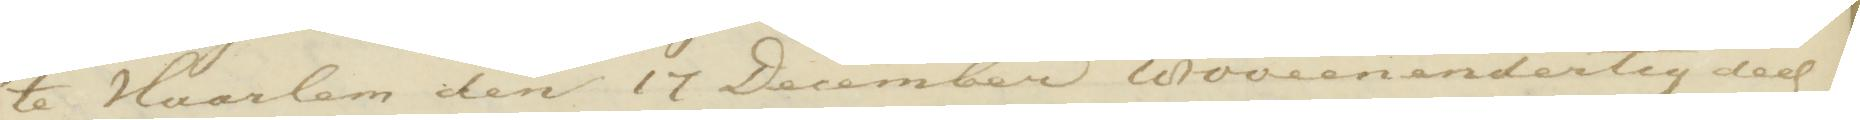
te Haarlem den 17 December 1800 een en dertig deel
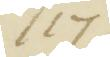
12/17
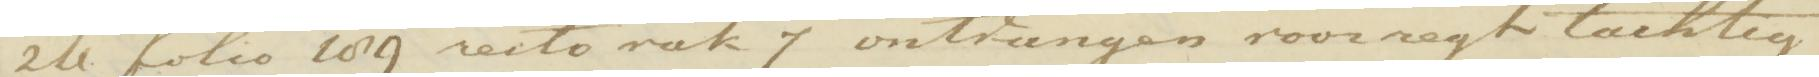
24 folio 189 recto vak 7 ontvangen voorregt tachtig
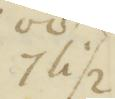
74½
